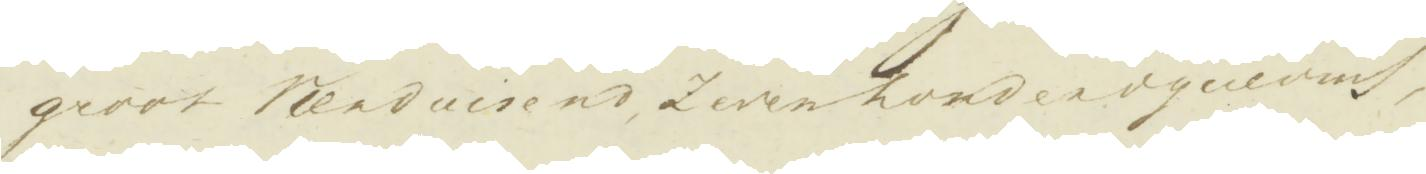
groot Vierduisend, Zevenhonderd guldens,
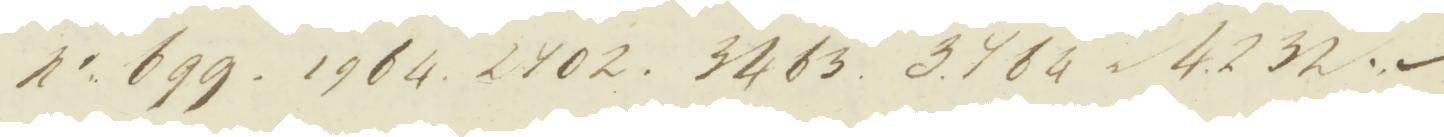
N„o 699. 1964. 2702. 3463. 3764 en 4232:—
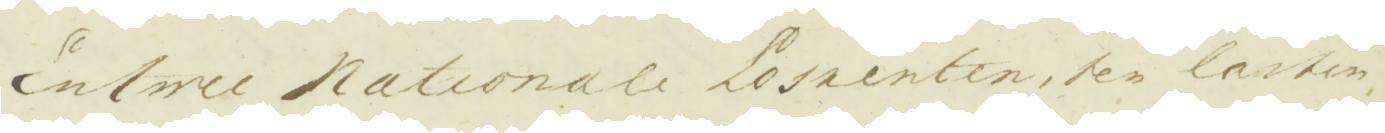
En twee Nationale Losrenten, ten lasten,
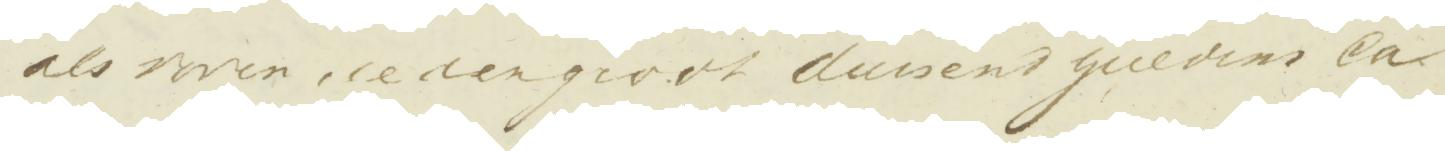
als voren, ieder groot duisend guldens Ca
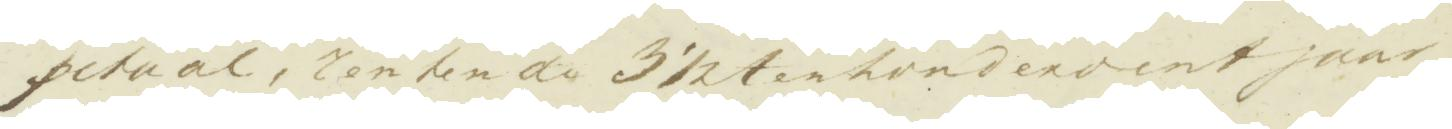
pitaal, rentende 3½ ten honderd int jaar,
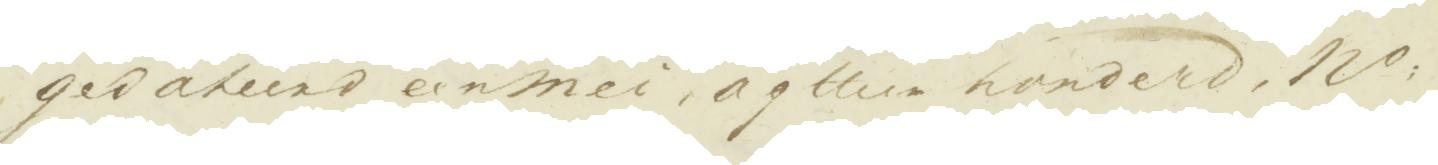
gedateerd een mei, agttien honderd, No:
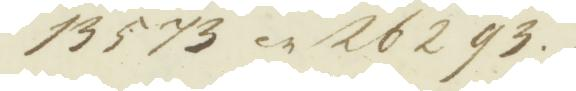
13573 en 26293.
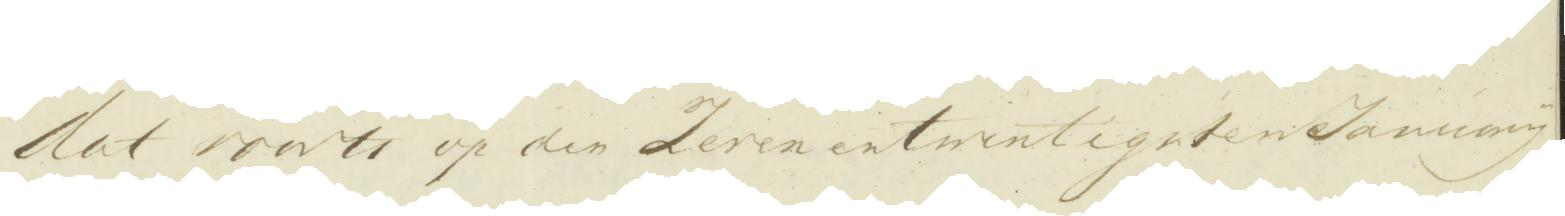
dat voorts op den Zeven en twintigsten Ianuarij
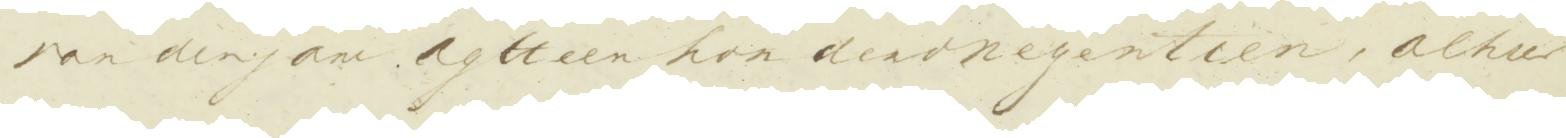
van den jare agttien honderdnegentien, alhier
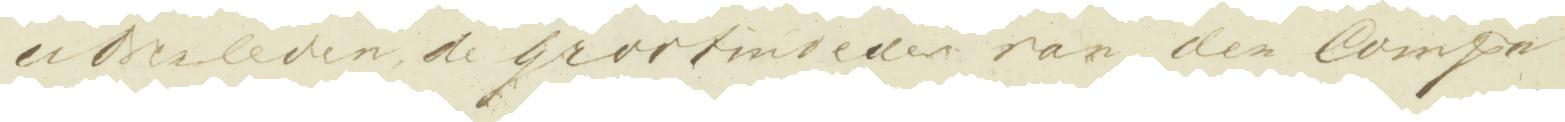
is overleden, de grootmoeder van den Compa
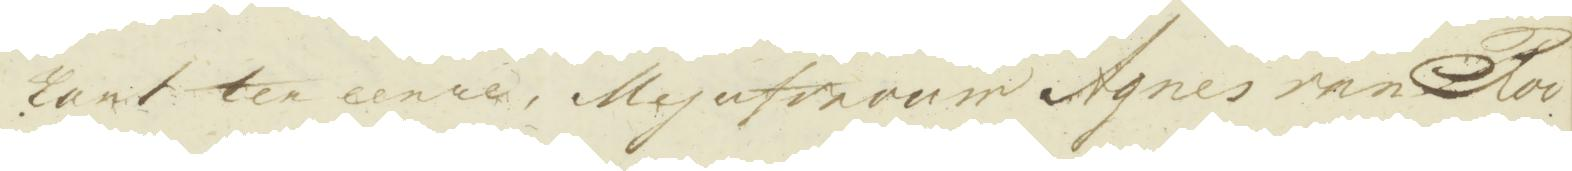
„rant ter eenre, Mejufvrouw Agnes van Roo
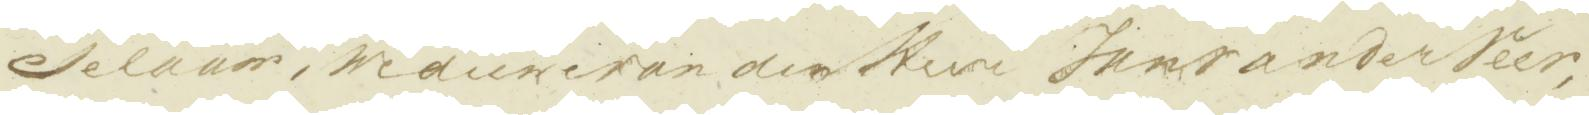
selaar, weduwe van den Heer Jan vander Veer,
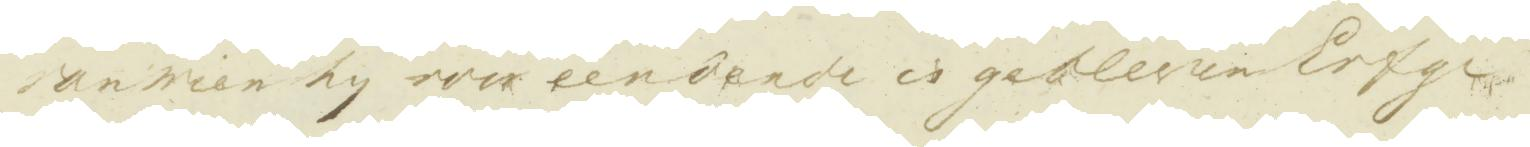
van wien hy voor een derde is gebleven Erfge
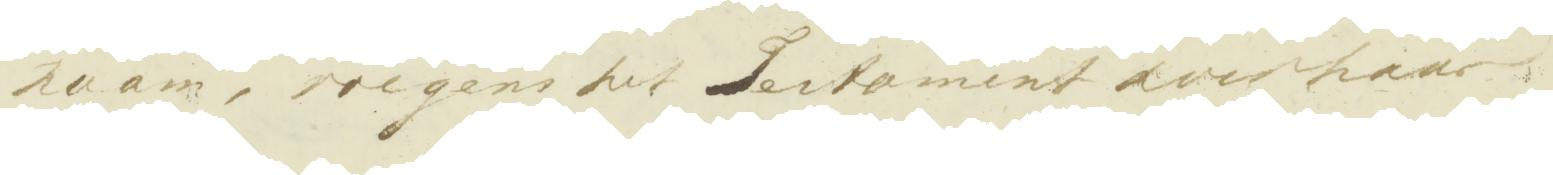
naam, volgens het Testament door haar
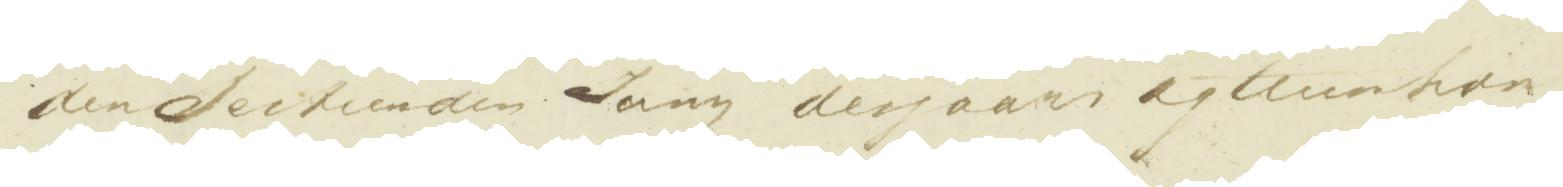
den Sestienden Iuny desjaars agttien hon
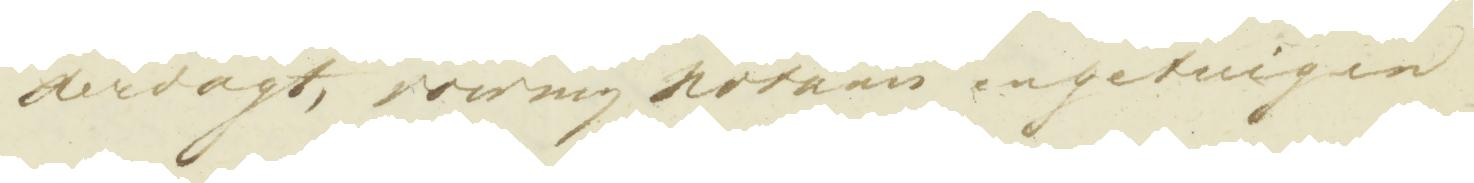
derdagt, voor my notaris en getuigen
